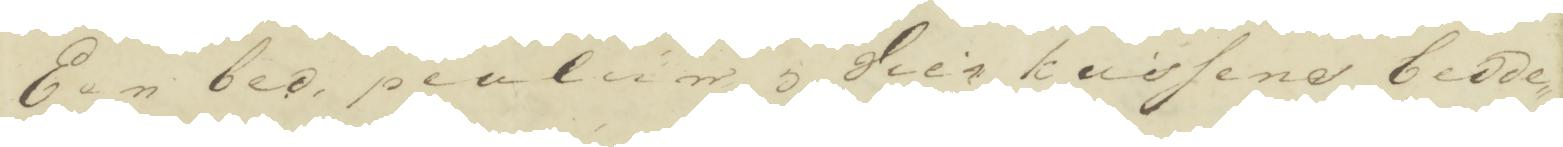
Een bed, perluw en Vier kussens bedde„
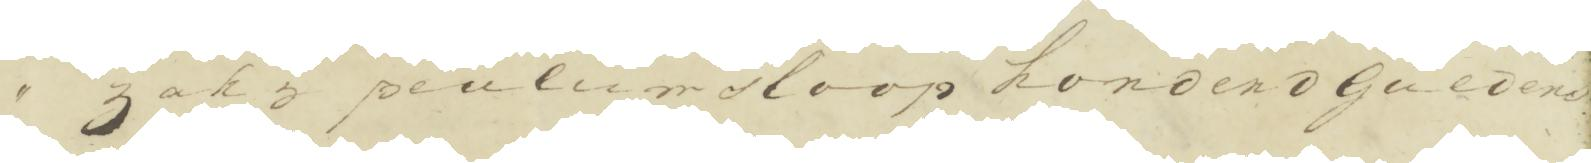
„ 100„ – „ zak en perluwsloop honderd Guldens
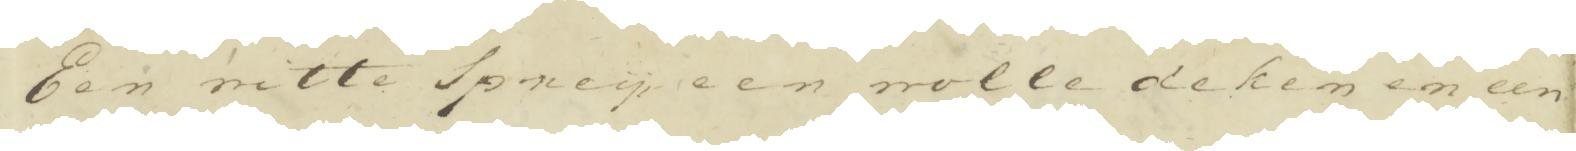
Een witte spreij, een wolle deken en een
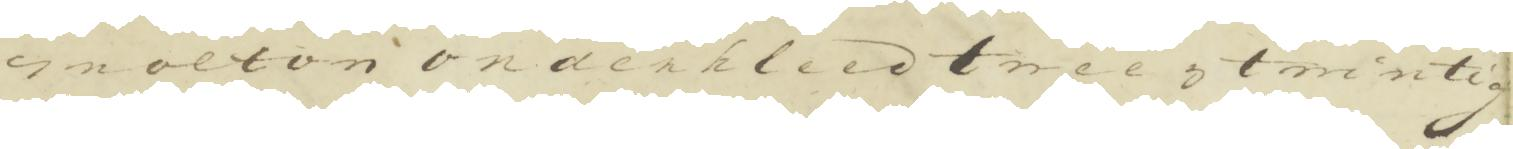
molton onderkleed twee en twintig
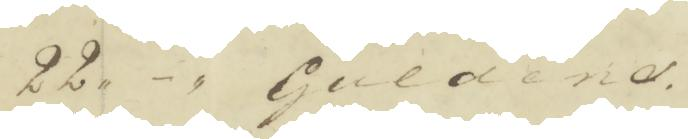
„ 22„ – „ Guldens.
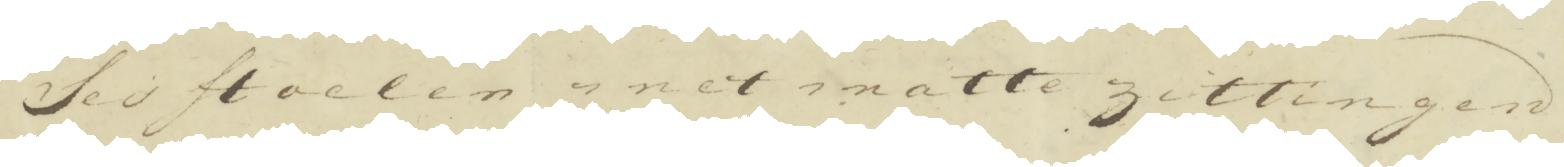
Ses stoelen met matte zittingen
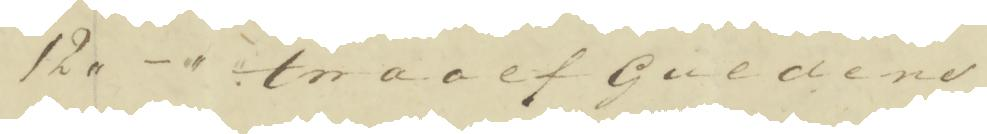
12„ – „ twaalf Guldens
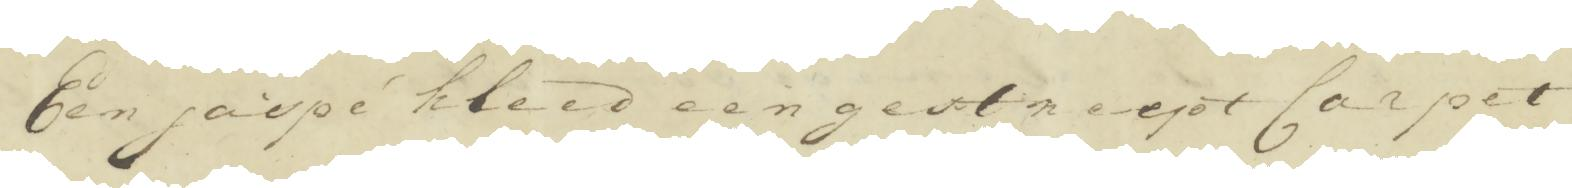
Een jaspe kleed een gestreept Carpet
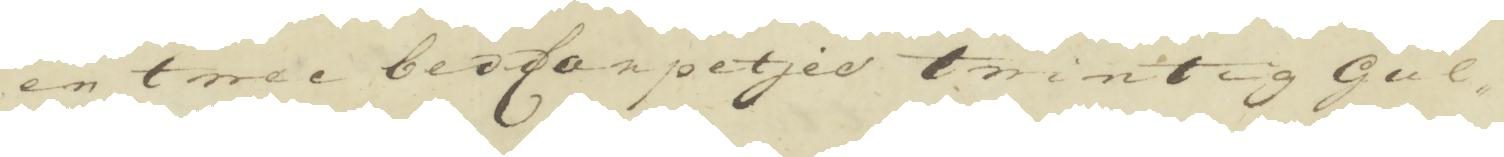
en twee bedcarpetjes twintig Guld„
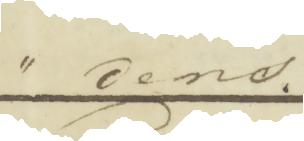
„ 20„ – „ dens.
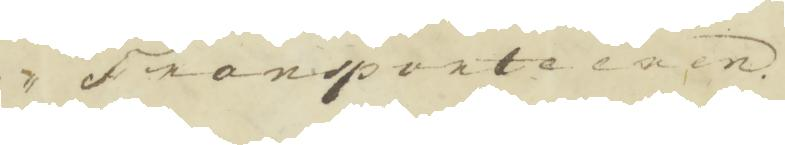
ƒ2,273„ – „ Transporteeren.
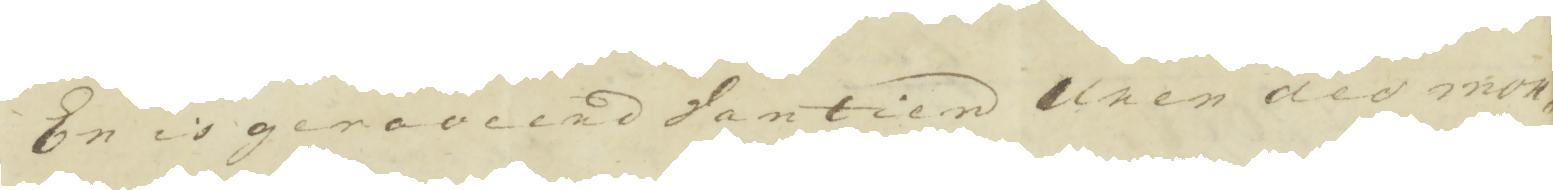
En is geraveerd van tien uren des mor
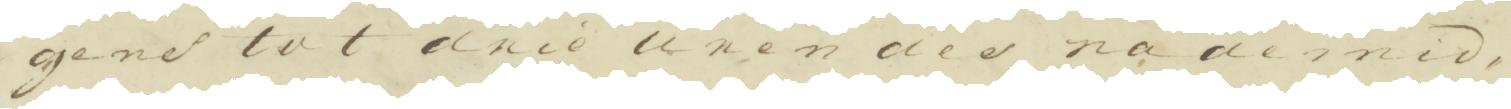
gens tot drie uren des na de mid„
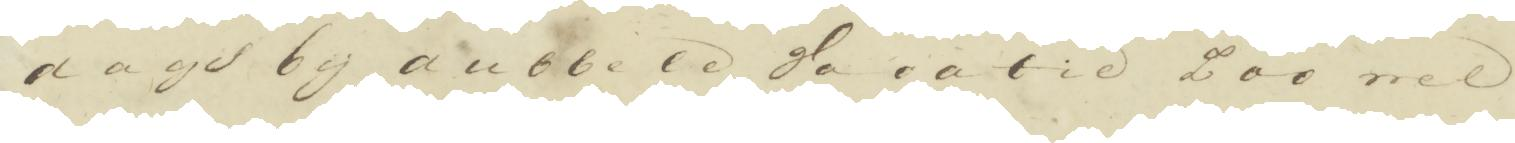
dags bij dubbele vacatie zoo wel
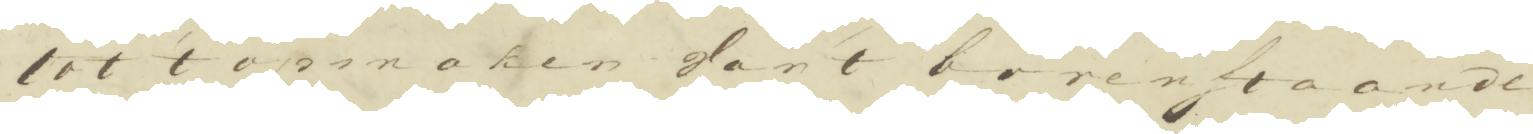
tot ’t opmaken van ’t bovenstaande
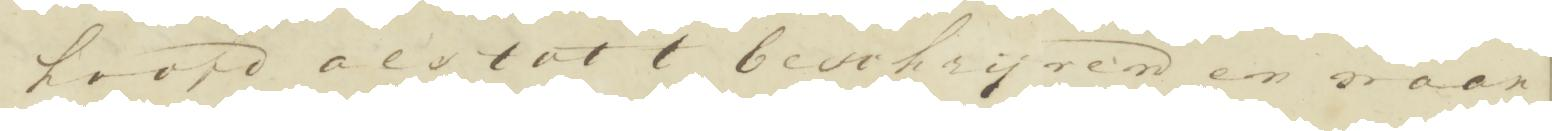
hoofd als tot ’t beschrijven en waar
